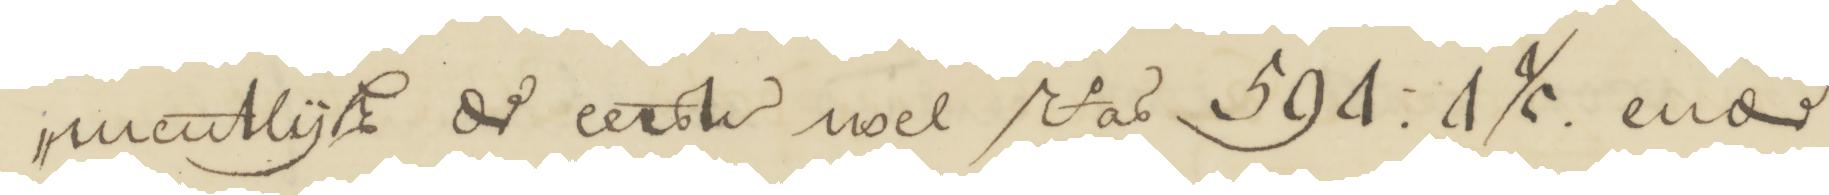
„mentlijk de eerste wel r o/as 594: 4 4/5. ende
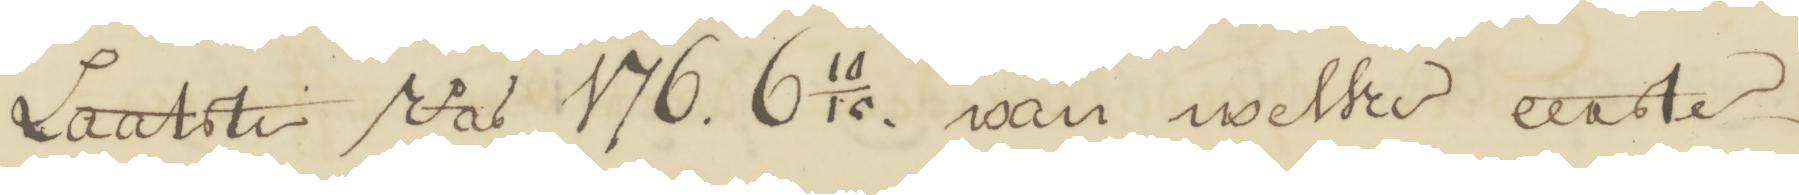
Laatste r o/as 176. 6 14/15. van welke eerste
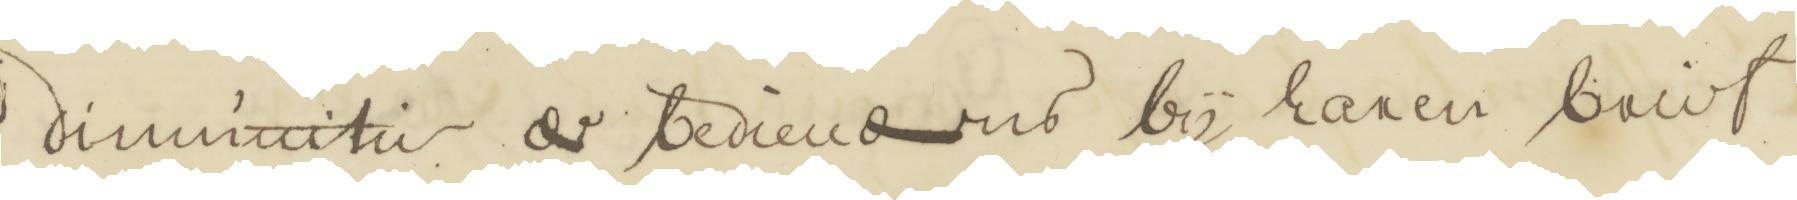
dimunitie de bediendens bij haren brief
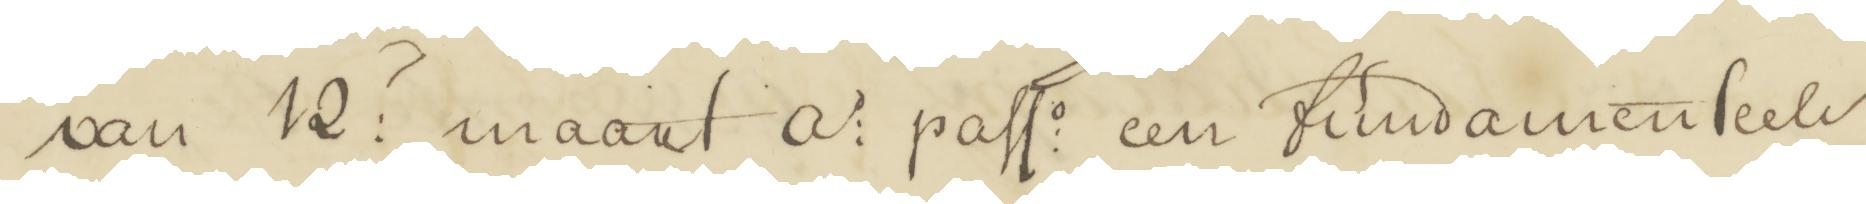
van 12:' maart a:o pass:o een fundamenteele
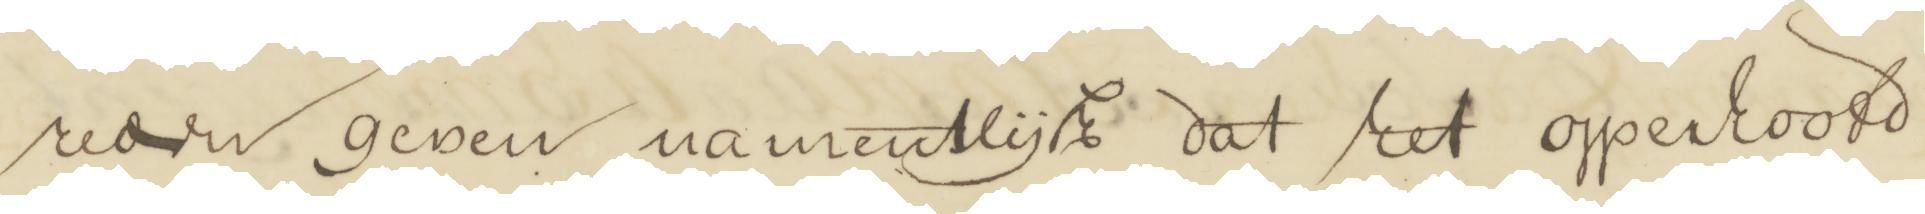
reden geven namentlijk dat het opperhoofd
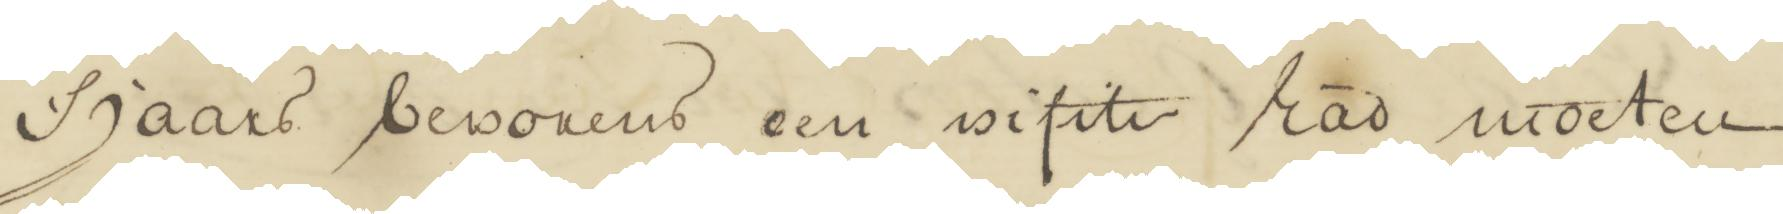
'S jaars bevorens een visite had moeten
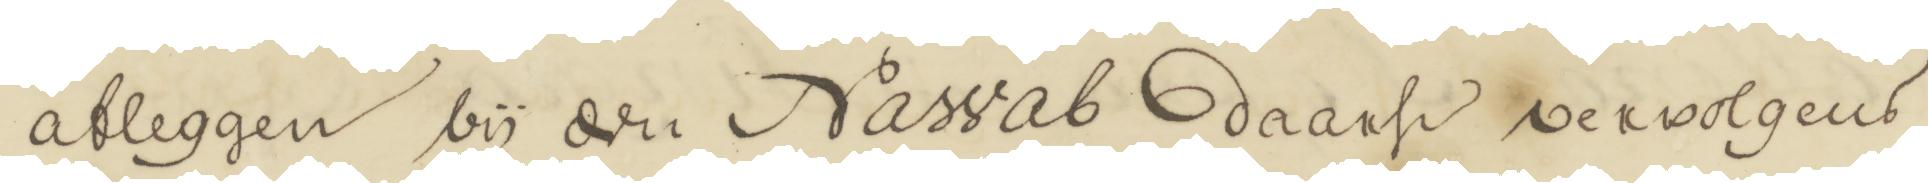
afleggen bij den Nawab daar se vervolgens
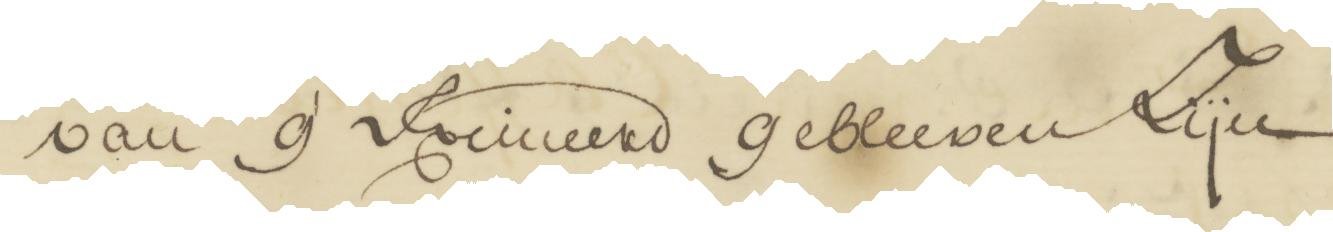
van g' Eximeerd gebleeven Zijn
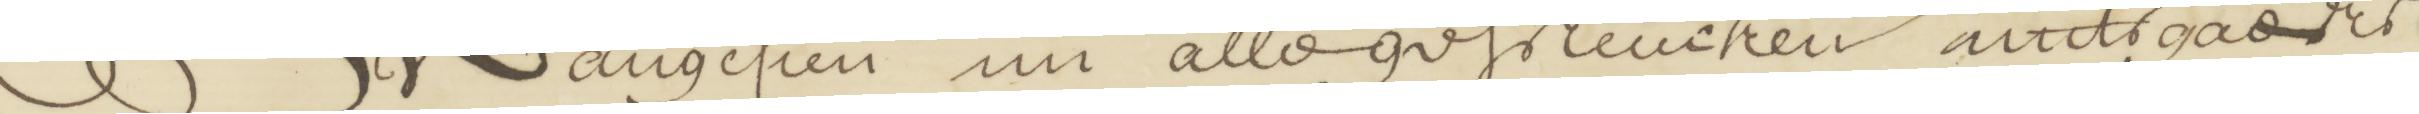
Aangesien nu alle geschencken mitsgaders
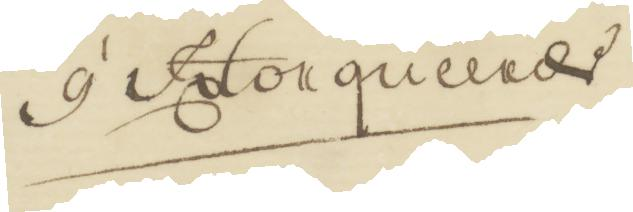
g’ Extorqueerde
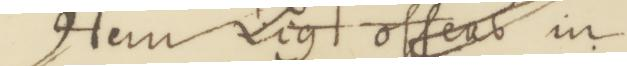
Jtem Zigt offers in
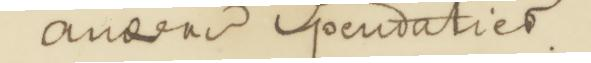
andere Spendaties
